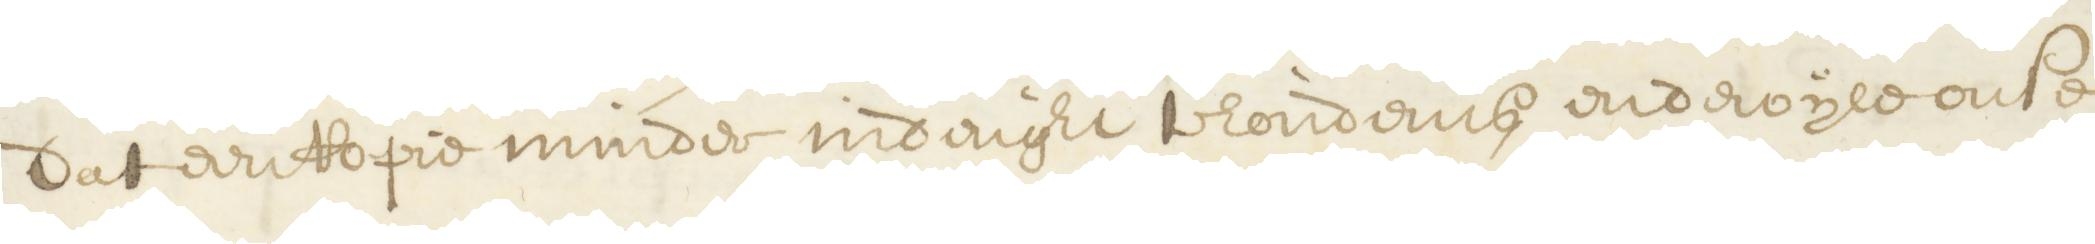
dat een Ropie minder indeught tehoudenis, en dewijle onse
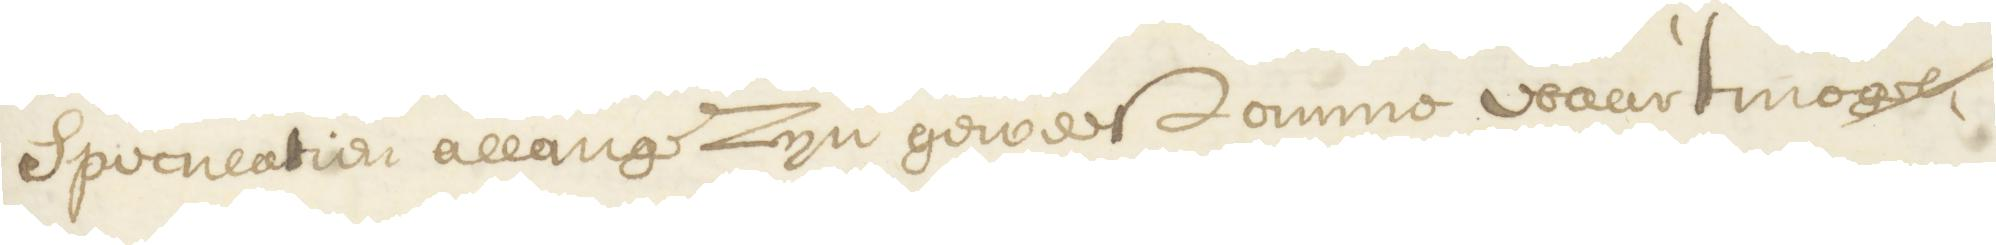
speculatien allange zijn geweest omme waar 't mogelijk
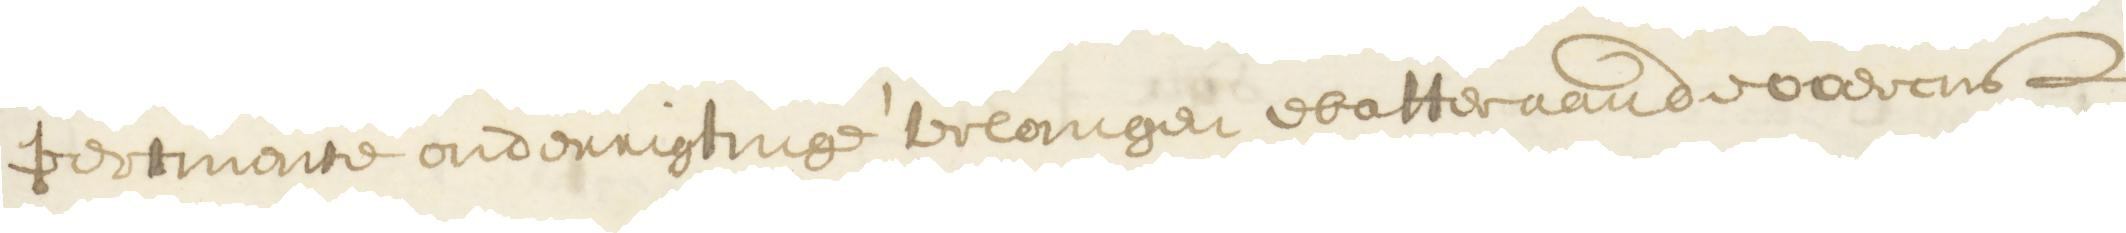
pertinente onderrigtinge 'terlangen watter aan de overcust
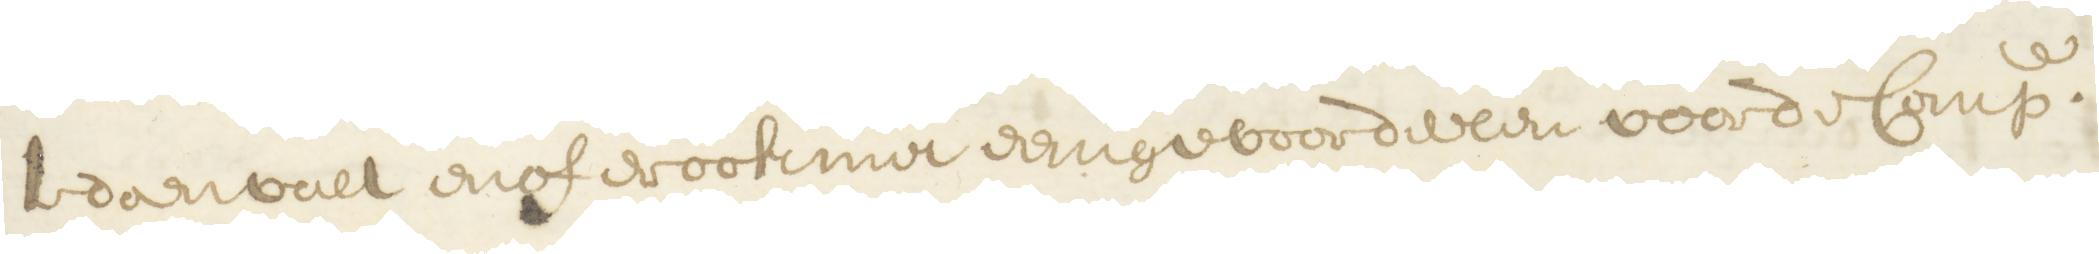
te doen valt en of er ook niet eenige voordeelen voor de Comp.e
